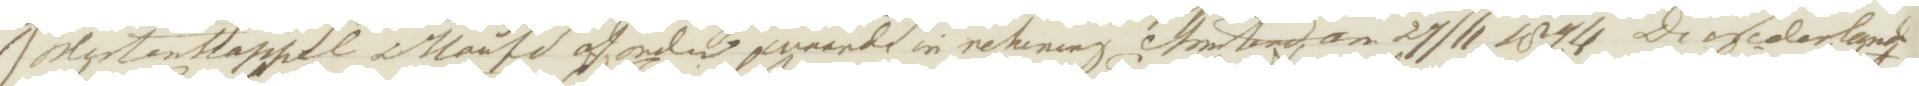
Martin Mappel & House of order waarde in rekening Amsterdam 27/11 1874 De Nederland
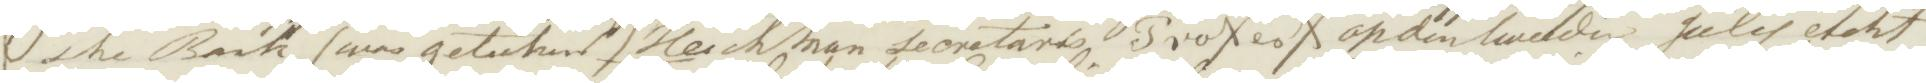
sche Bank (was getekeend) Heichman secretaris, Protest op den tweede July Acht
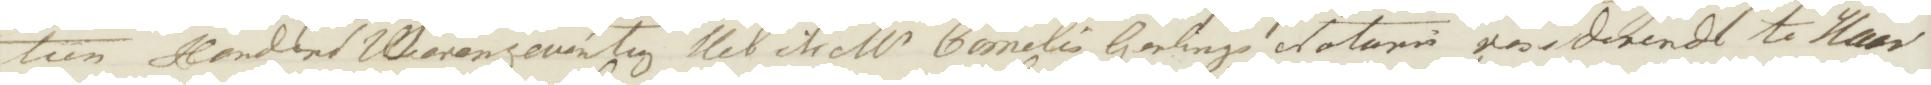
tien Honderd Vierenzeventig Heb ik Mr Cornelis Gerlings Notaris residerende te Haar
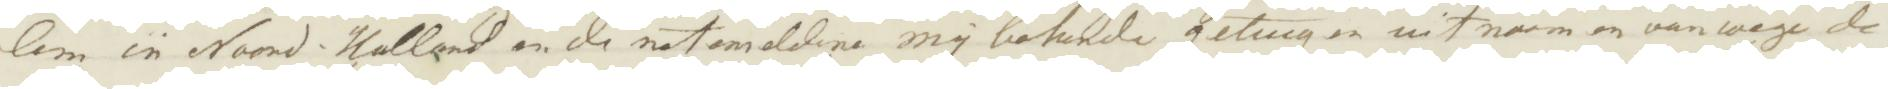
lem in Noord-Holland en de natemeldene mij bekende getuigen uit naam en van wege de
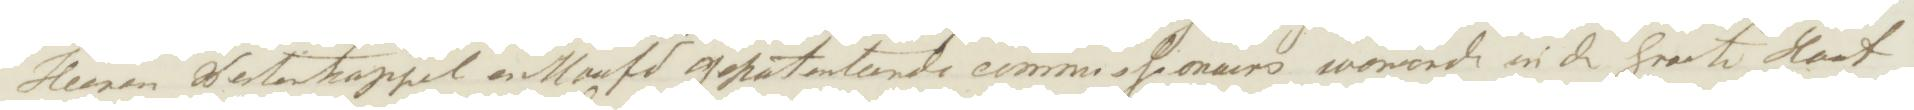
Heeren Westenkappel en Hoofd gepatenteerde commissionairs wonende in de Groote Hout
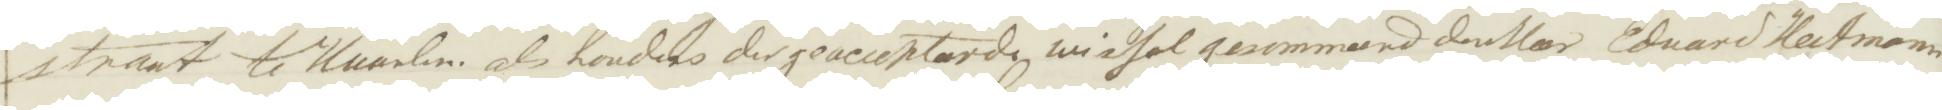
straat te Haarlem als houders der geaccepteerde wissel gesommeerd den Heer Eduard Heitmann
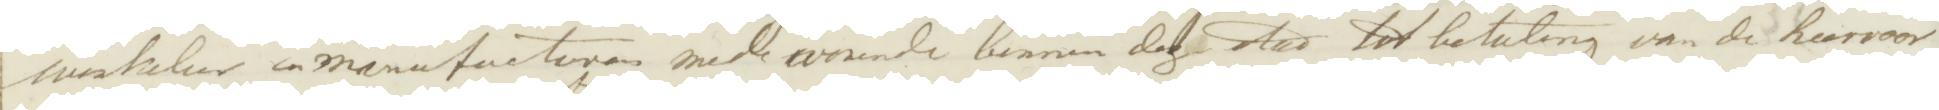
winkelier in manufacturen mede wonende binnen deze stad tot betaling van de hiervoor
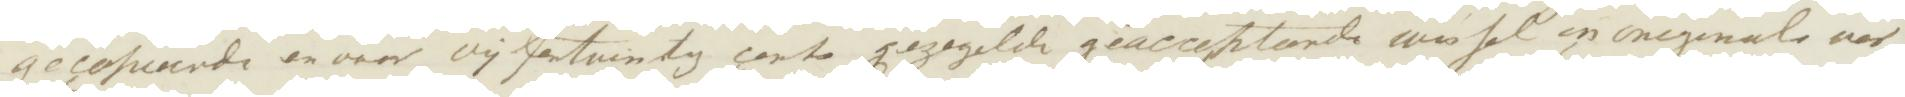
gecopieerde en voor vijfentwintig cents gezegelde geaccepteerde wissel in originali ver
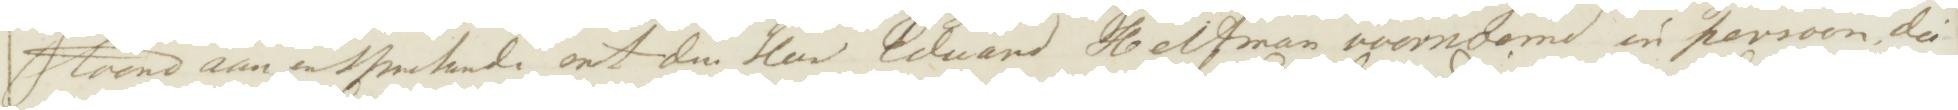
toond aan en sprekende met den Heer Eduard Heitman voornoemd in persoon, die
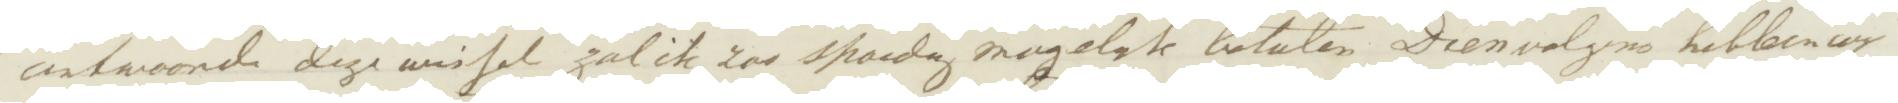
antwoorde deze wissel zal ik zoo spoedig mogelyk betalen Dien volgens hebben wy
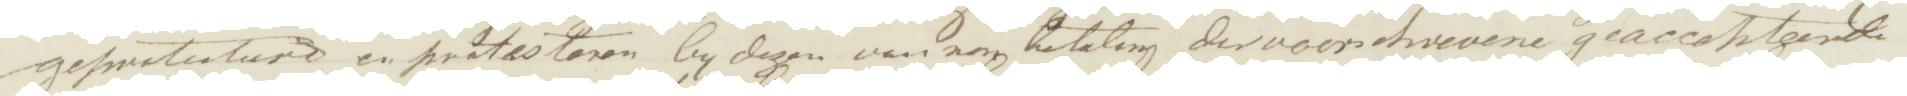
geprotesteerd en protesteren by dezen van non betaling der voorschrevene geaccepteerde
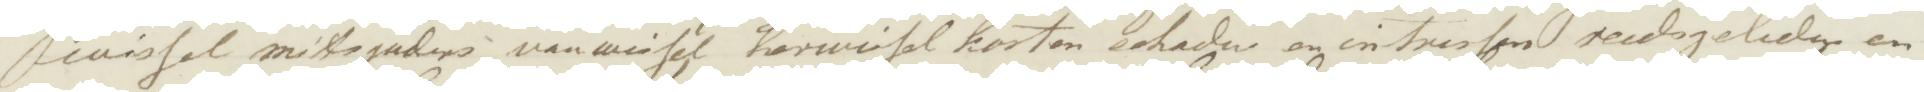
wissel mitsgaders van wissel herwissel kosten schaden en intressen reeds geleden en
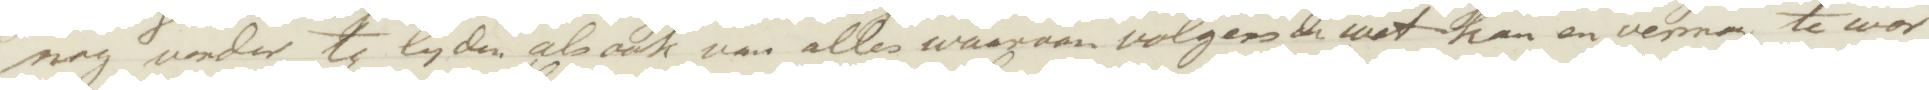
nog verder te lyden als ook van alles waarvan volgens de wet kan en vermag te wor
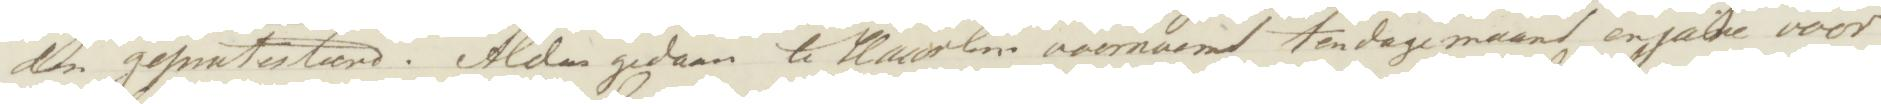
den geprotesteerd. Aldus gedaan te Haarlem voornoemd ten dage maand en jare voor
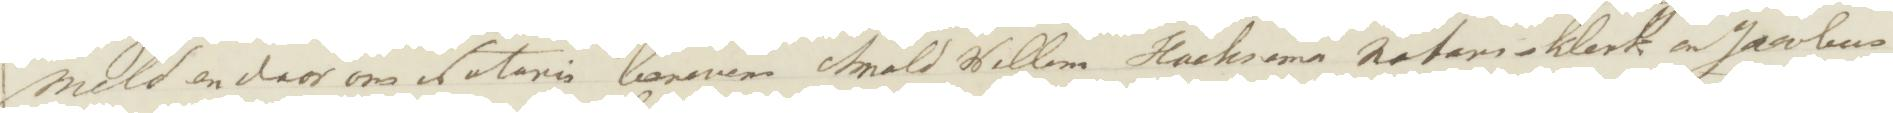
meld en door ons Notaris benevens Arnold Willem Haeksema notaris-klerk en Jacobus
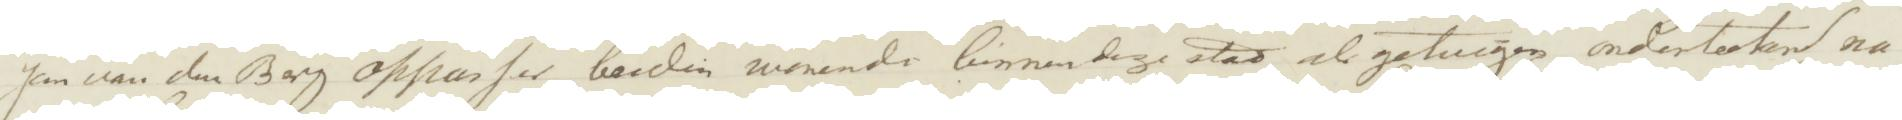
Jan van den Berg Oppasser beiden wonende binnen deze stad als getuigen onderteekend na
